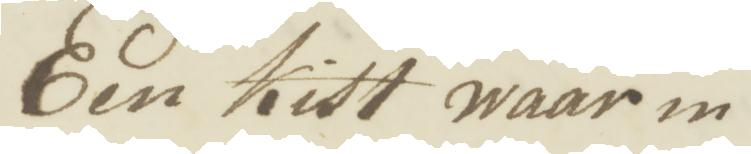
Een kist waar in
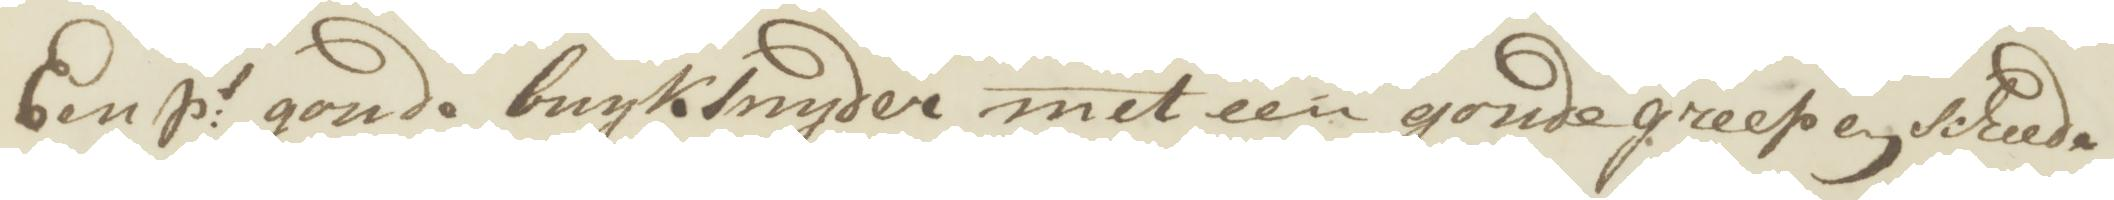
Een p:s goude buyksnyder met een goude greepen scheede
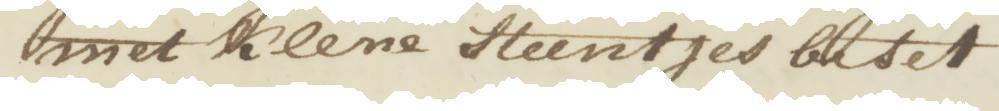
met klene steentjes beset
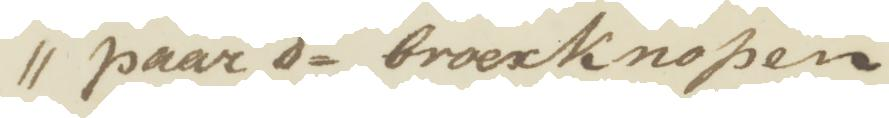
„ paar d=o broecknopen
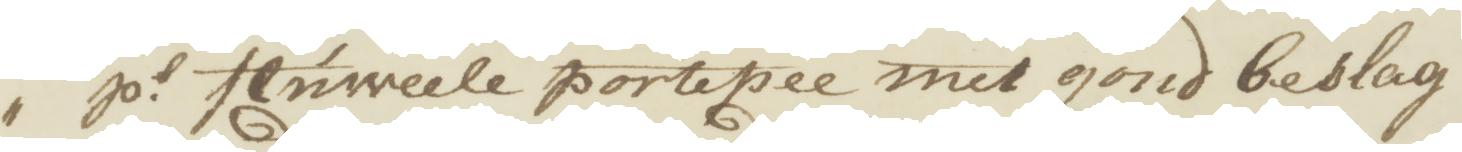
„ p.s fluweele portepee met goud beslag
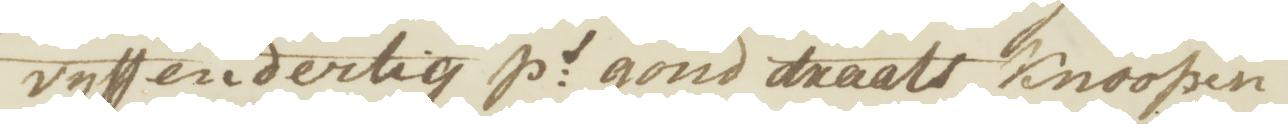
vyff en dertig p:s goud draats knoopen
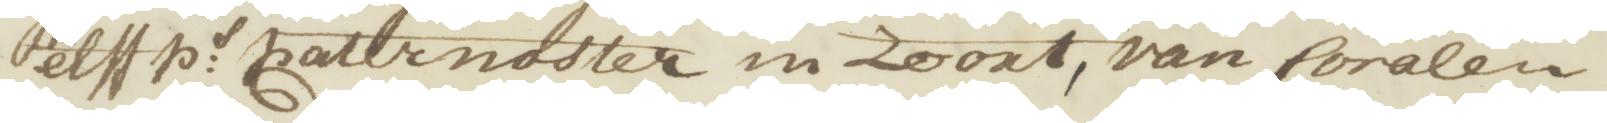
elff p:s paternoster in zoort, van Coralen
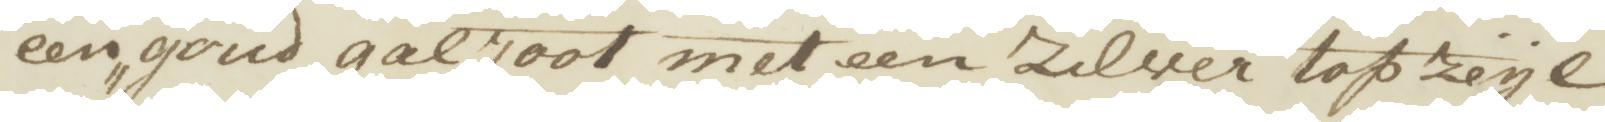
een „ goud galjoot met een zilver top zeijl
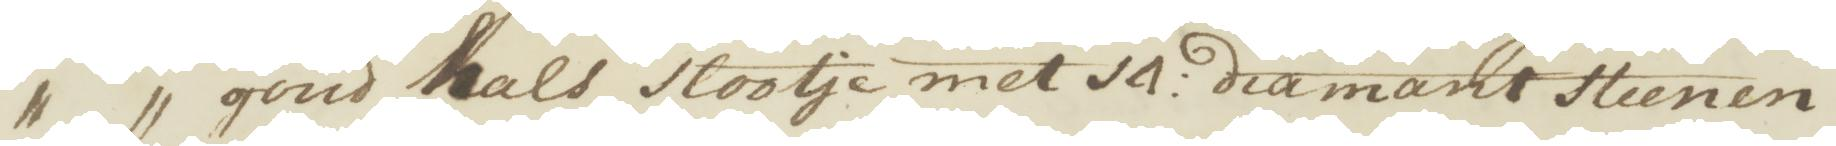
„ „ goud hals slootje met 14: diamant steenen
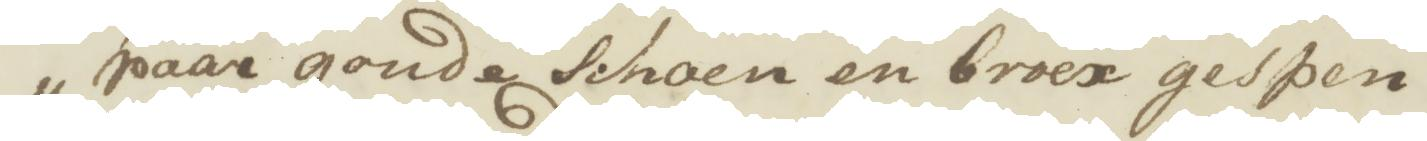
„ paar goude schoen en broex gespen
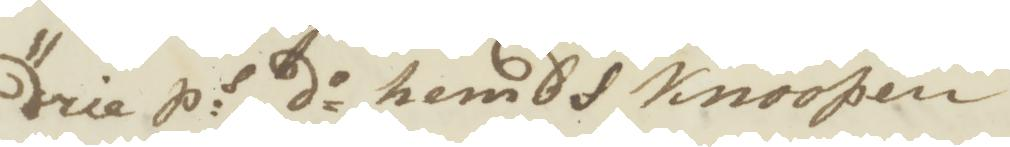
drie p:s d=o hembs knoopen
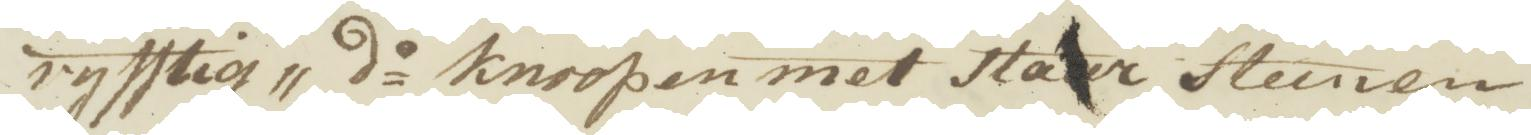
vyfftig „ d=o knoopen met staar steenen
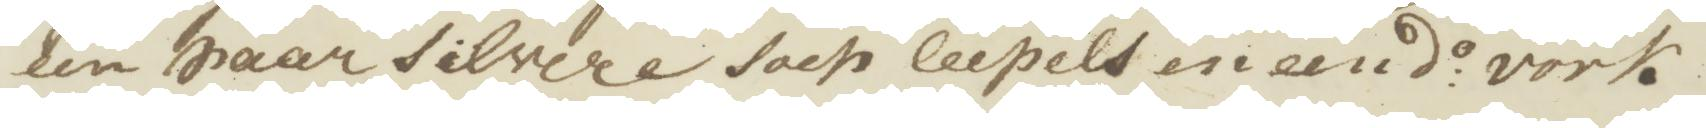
Een paar silvere soep leepels en een d:o vork
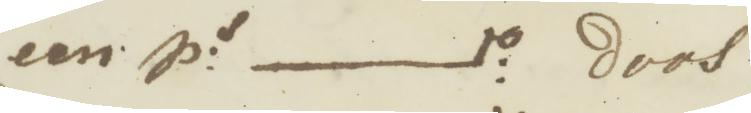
een p:s _:o doos
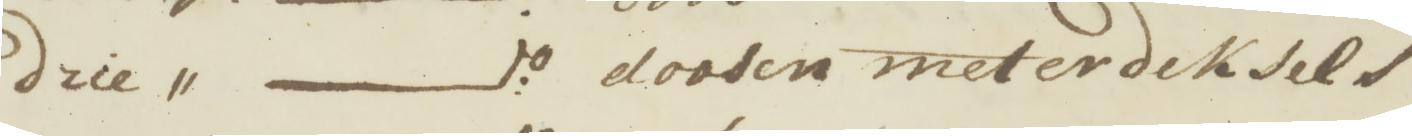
drie „ _:o doosen met er deksels
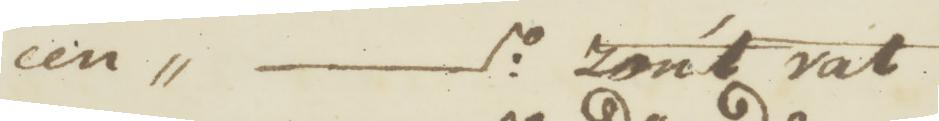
een „ _:o zout vat
